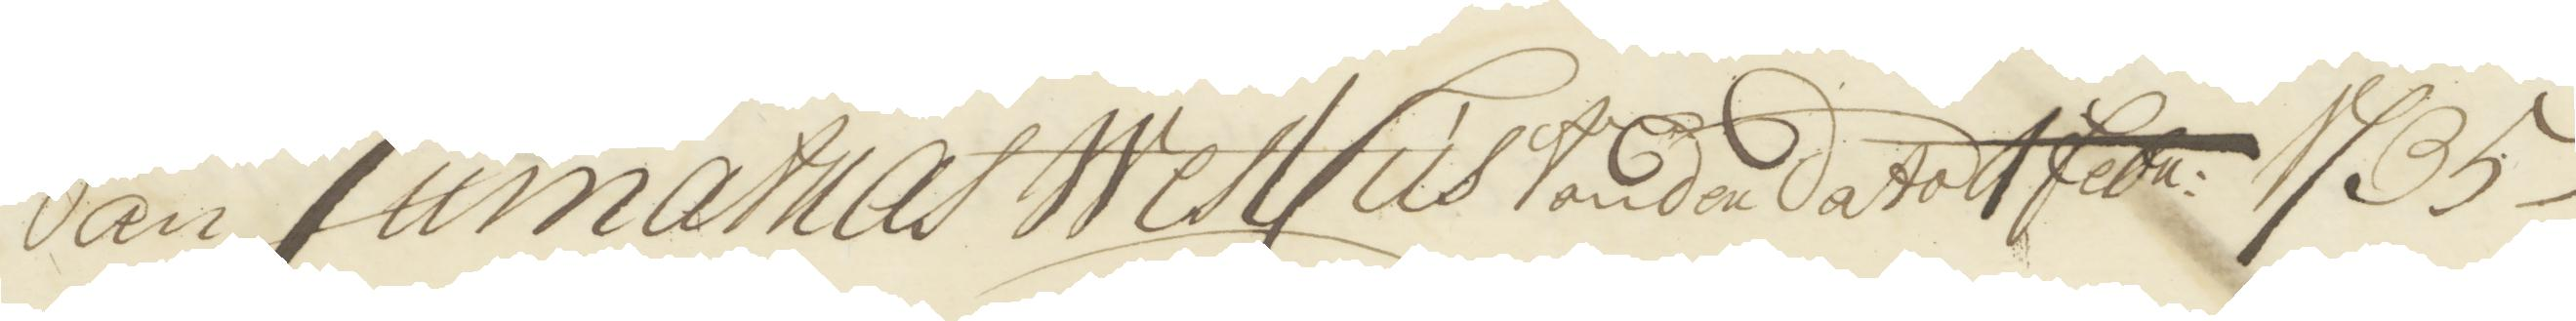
Van Sumatras WestCust onder dato 4 febr: 1735 —
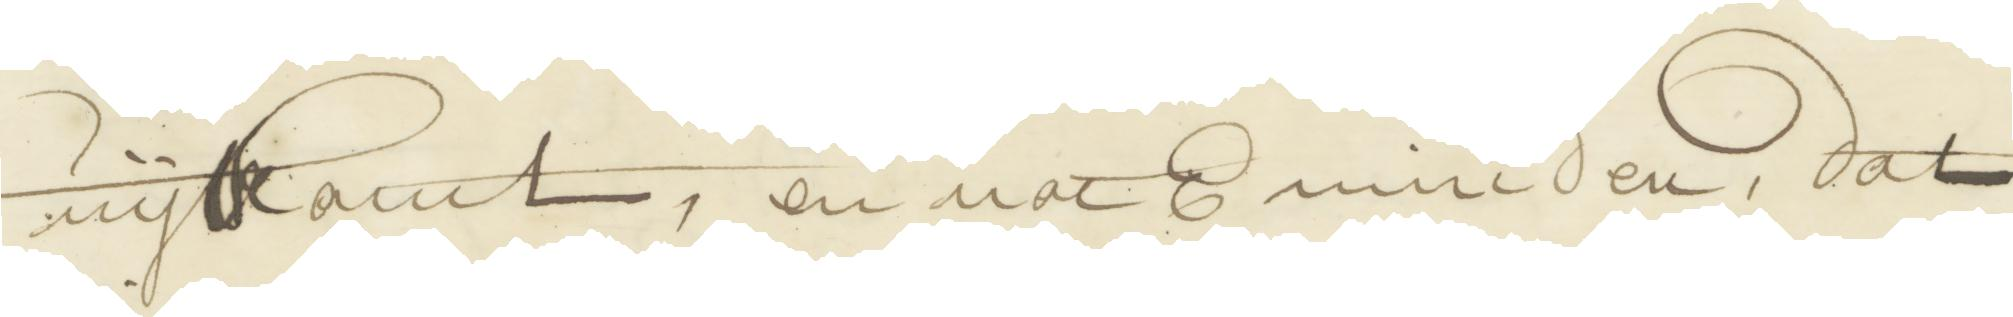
uijkkamt, en noch minder, dat
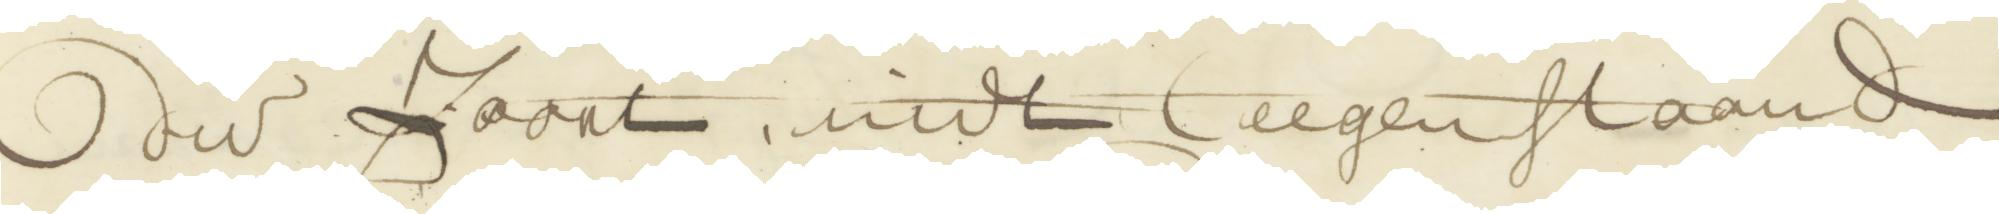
die zoort, niet teegenstaande
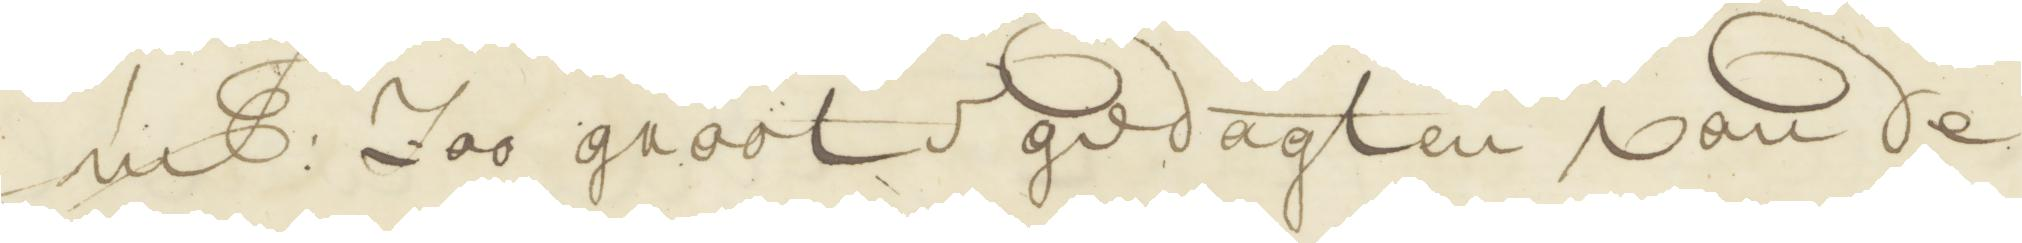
uE: zoo groote gedagten van de
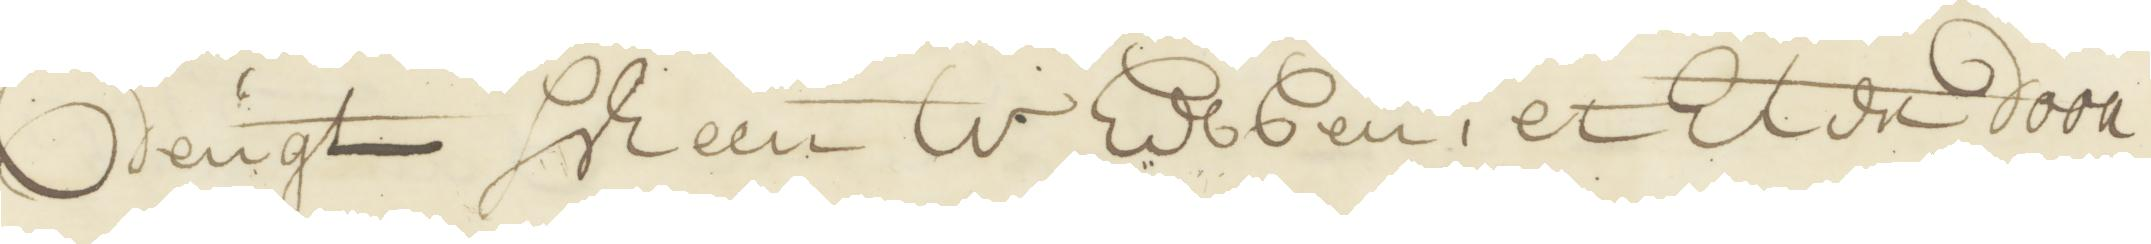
deugt scheen te hebben, echter door
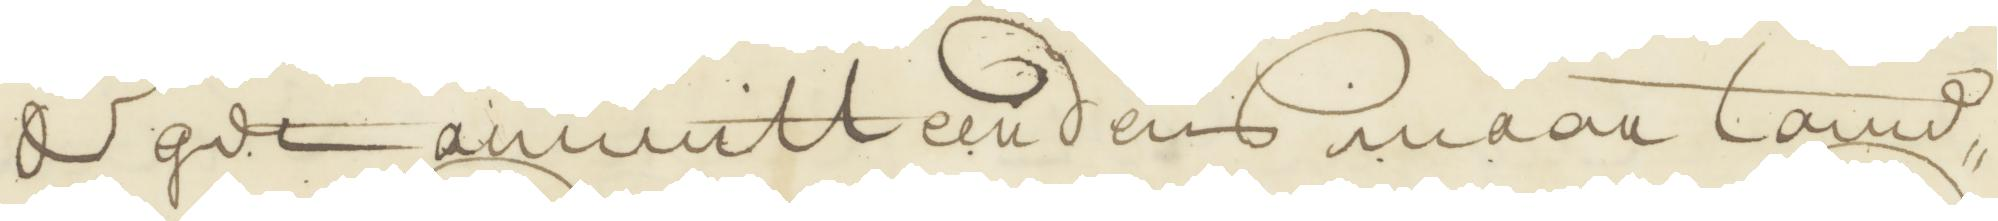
de gecommitteerdens maar tame„
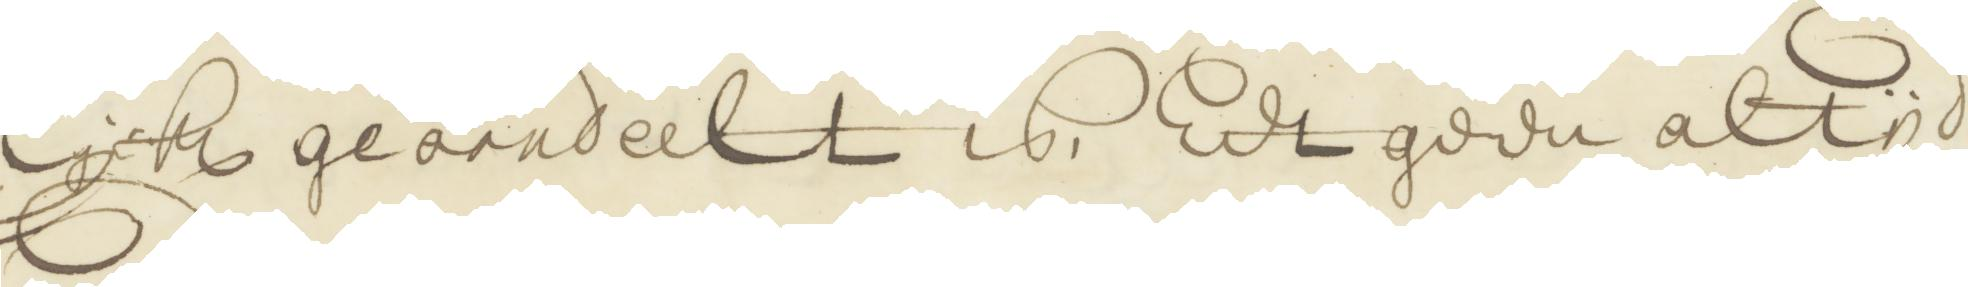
lijk geoordeelt is, het geen altijd
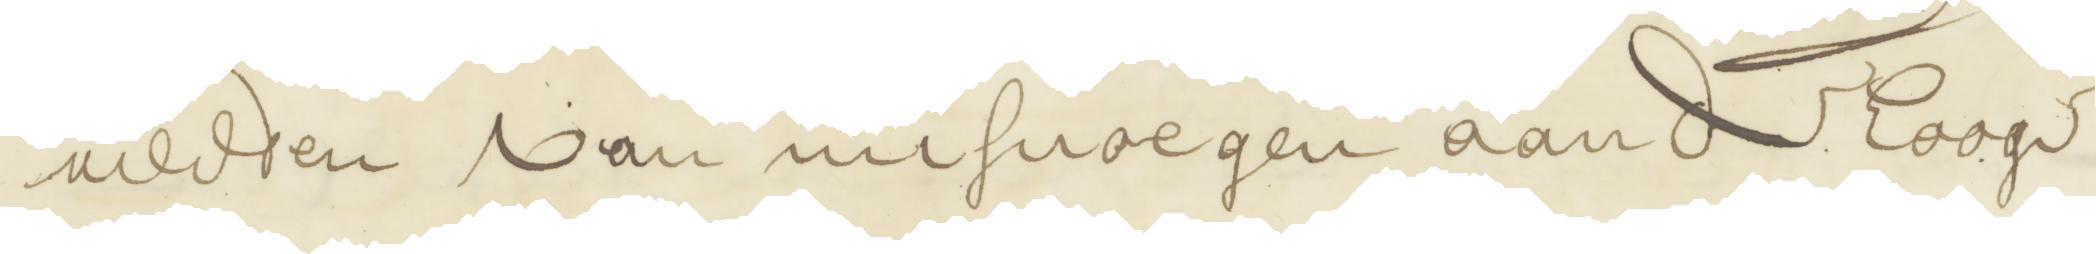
reeden van misnoegen aan de hooge
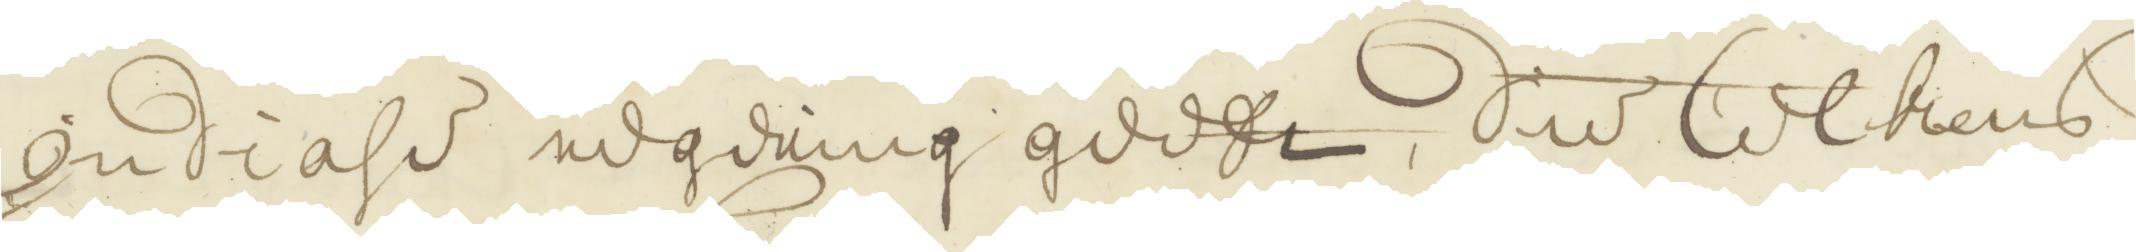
Jndiase regering geeft, die telkens
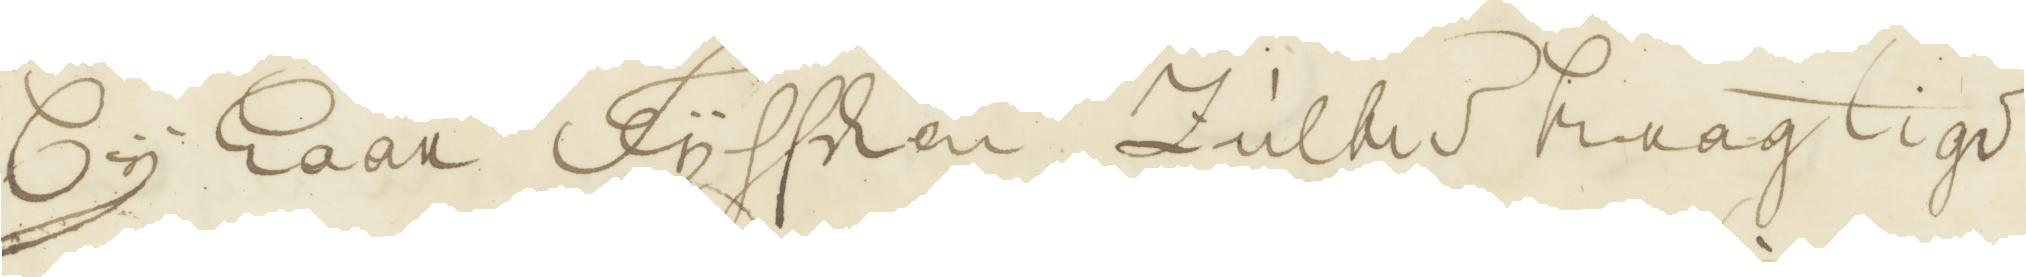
bij haar eijsschen zulke kragtige
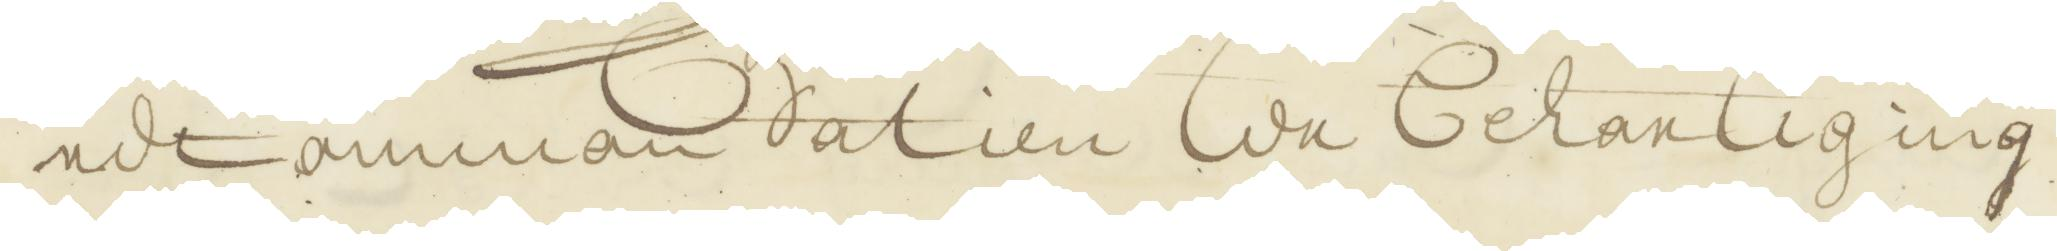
recommendatien ter behartiging
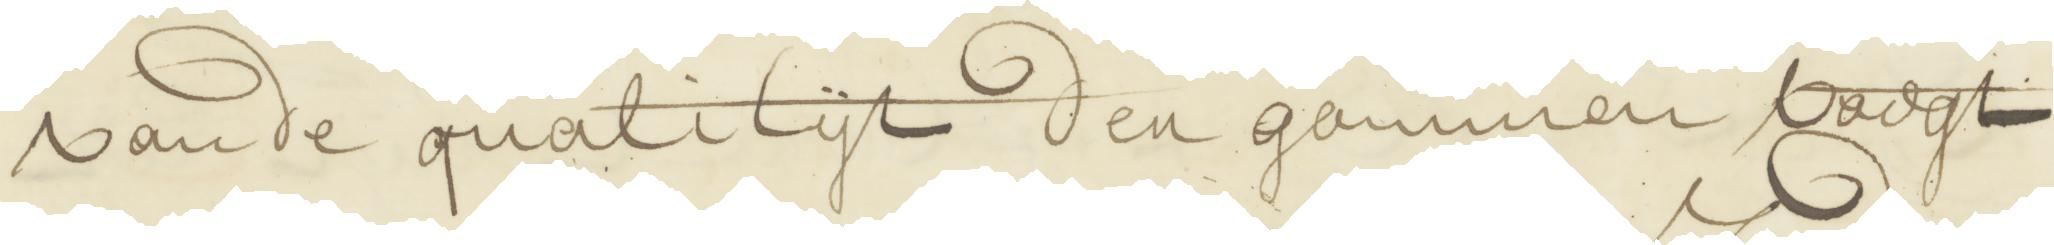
van de qualitijt der gommen voegt
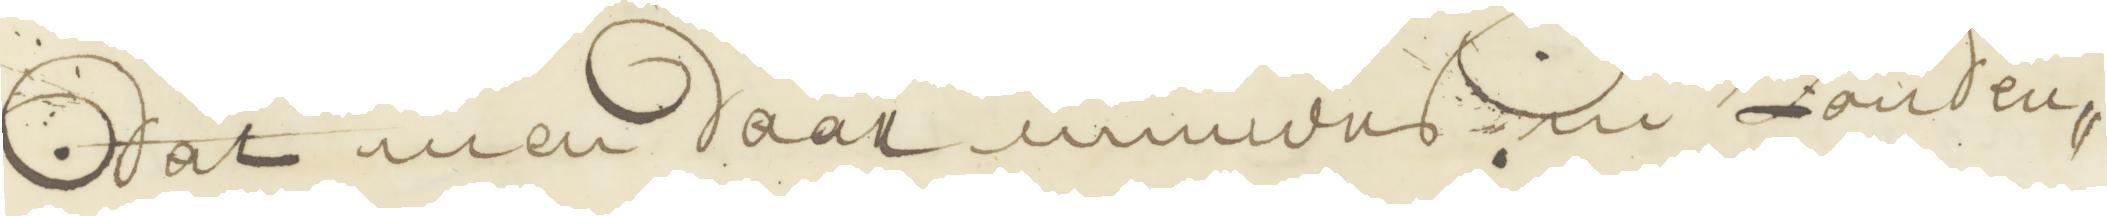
dat men daar immers in zonder„
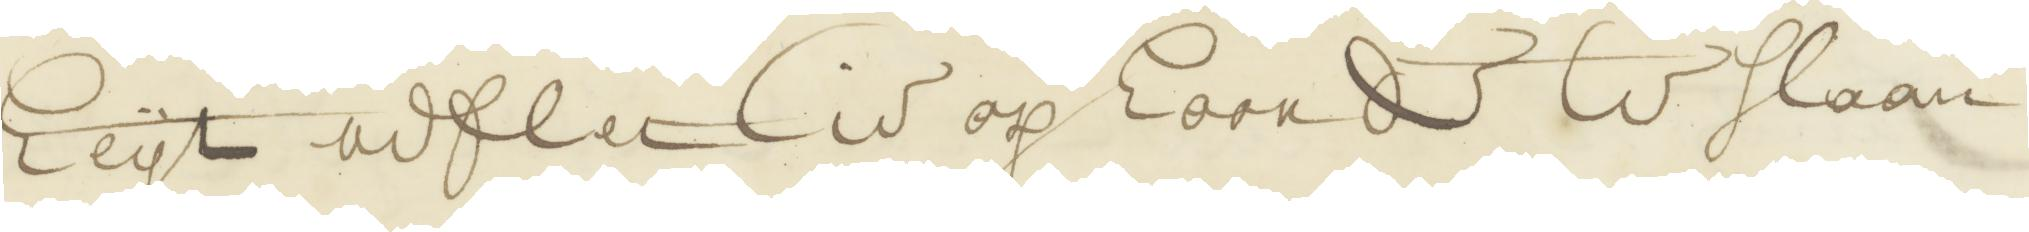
heijt reflectie op hoorde te slaan
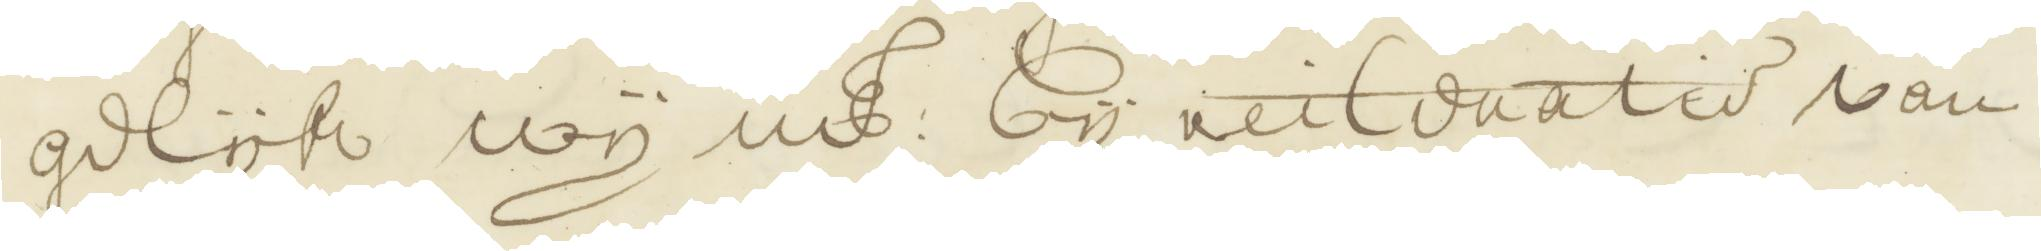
gelijk wij uE: bij reiteratie van
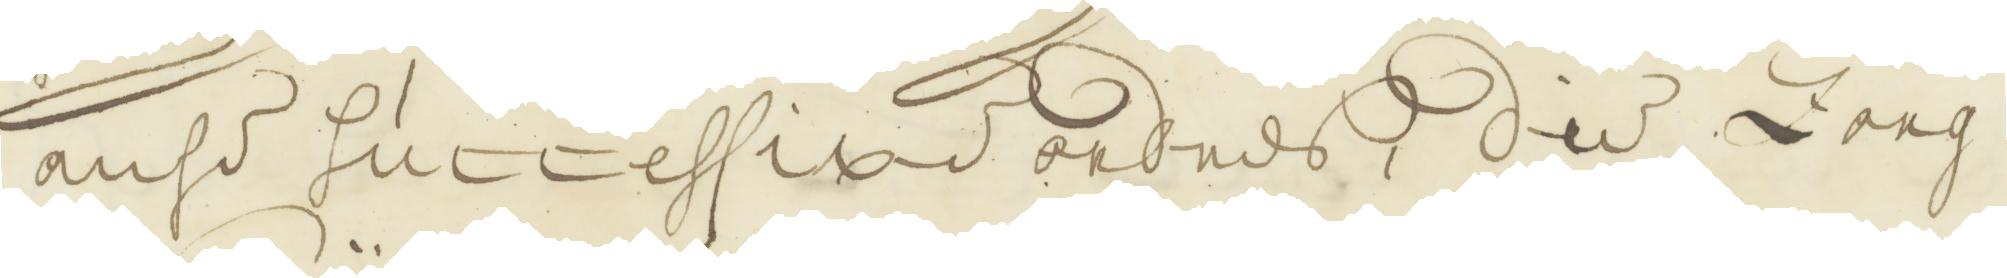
onse successive ordres, die zorg
